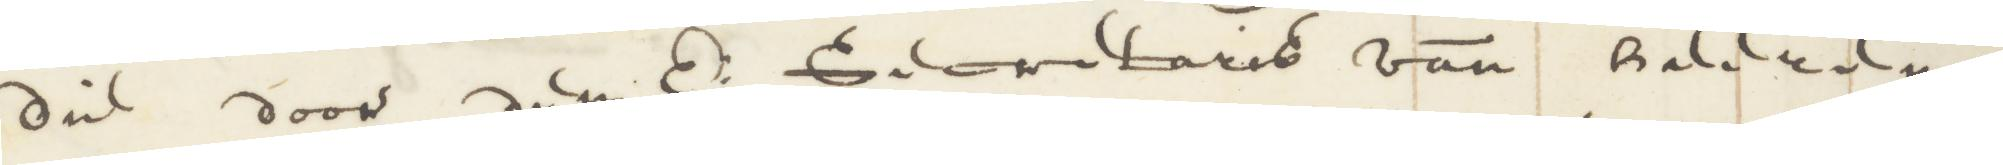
die door den E: Secretaris van heeren
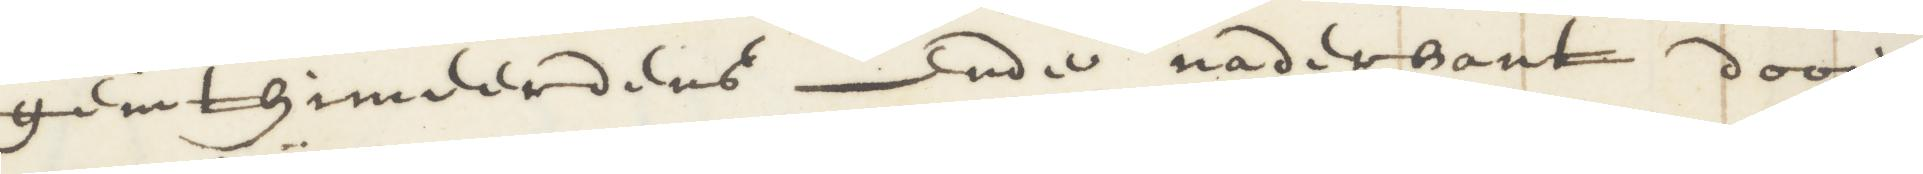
geinthimeerdens ende naderhant door
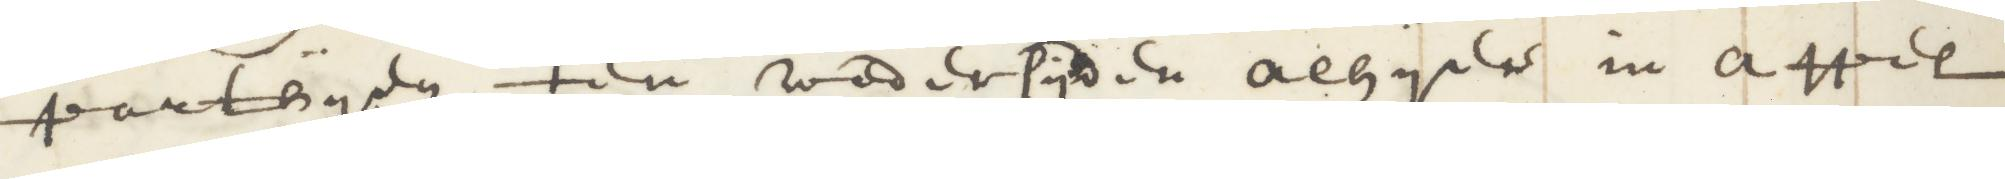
parthijen ten wedersijder alhijer in appel
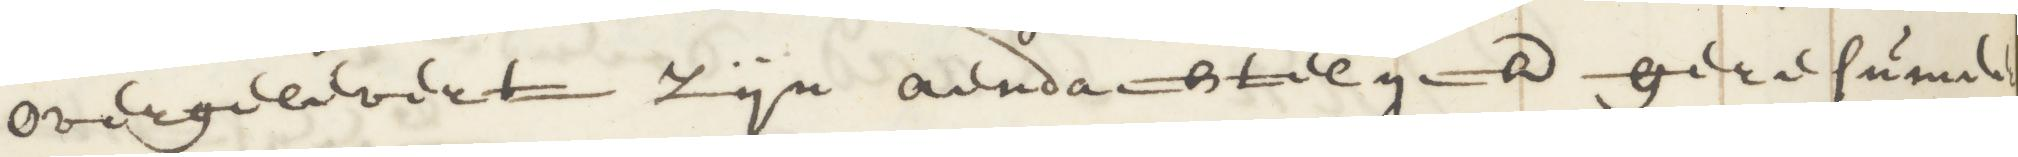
overgelevert zijn aendachtelijck geresumen
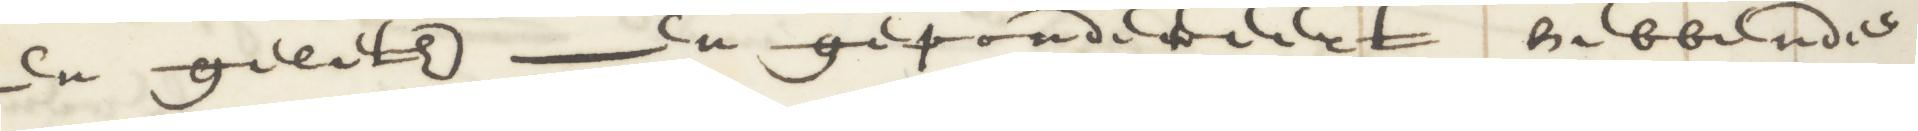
en geleth en gepondereert hebbende
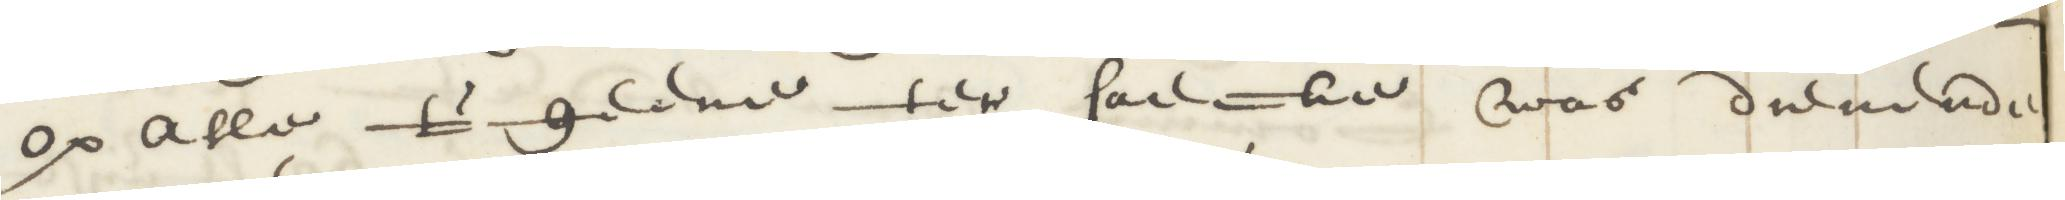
op alle t'geene ter saecke was dienende
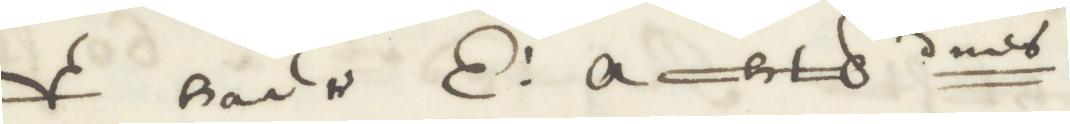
f haer E: achtb=dres
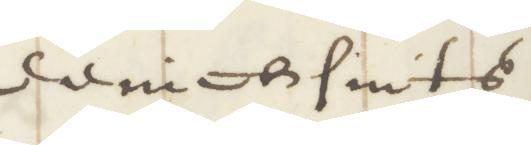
eenichsints
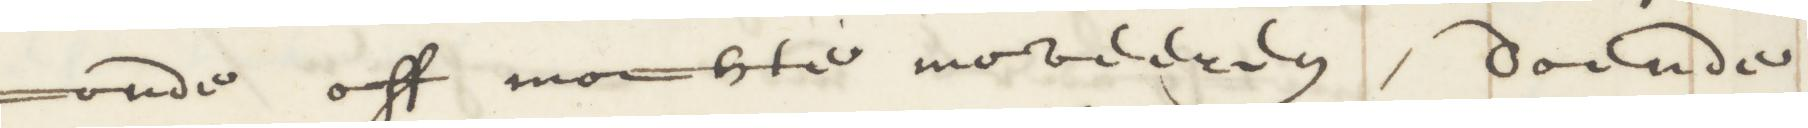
zoude off mochte moveeren, doende
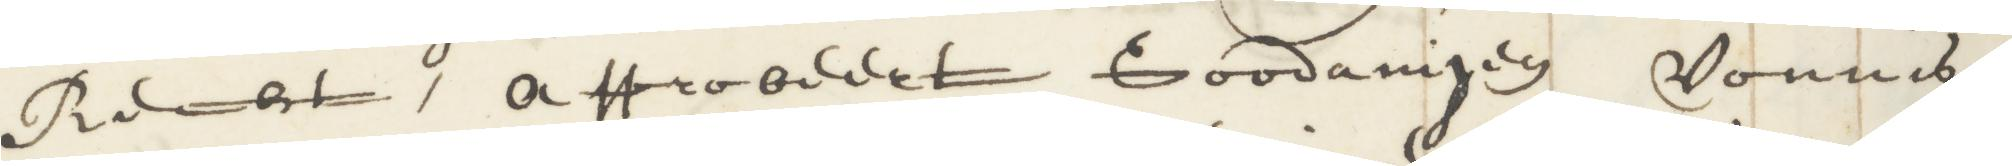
Recht, approbeert soodanigen Vonnis
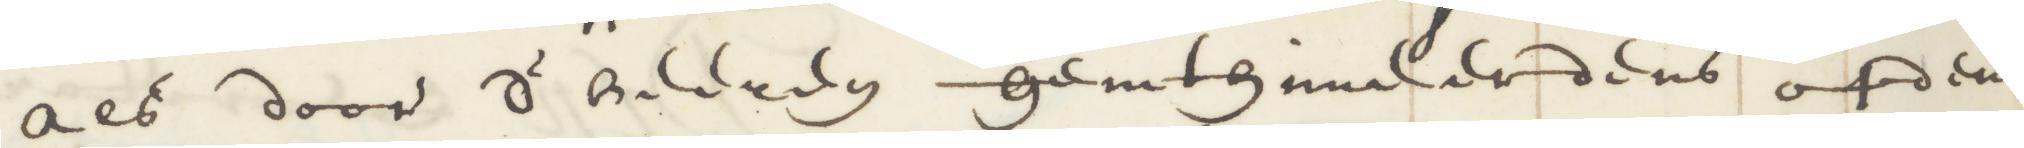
als door d’ heeren geinthimeerdens op den
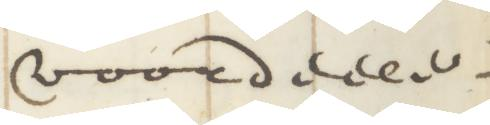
voordeele
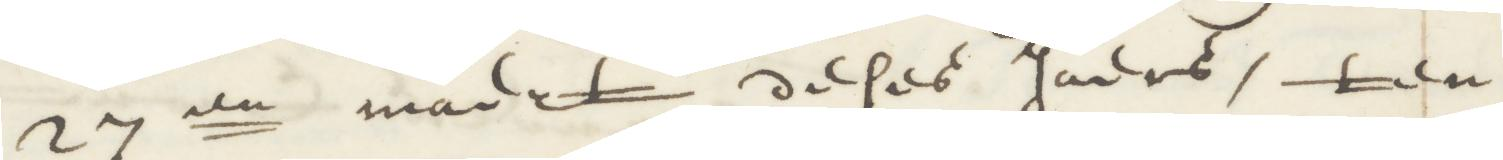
27=en maert deses Jaers, ten
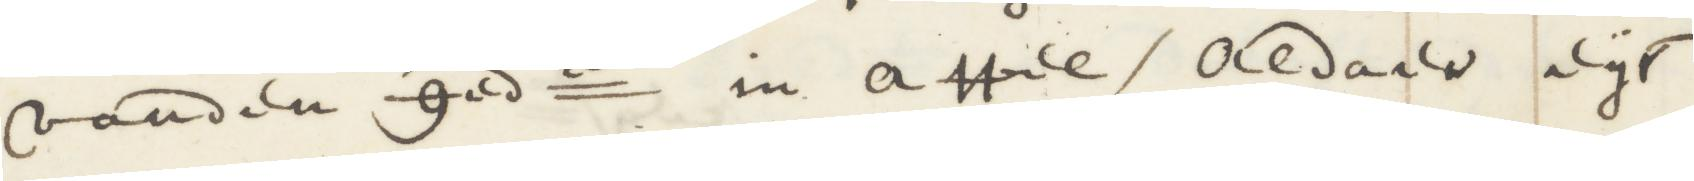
van den ged=e in appel, aldaer eijs
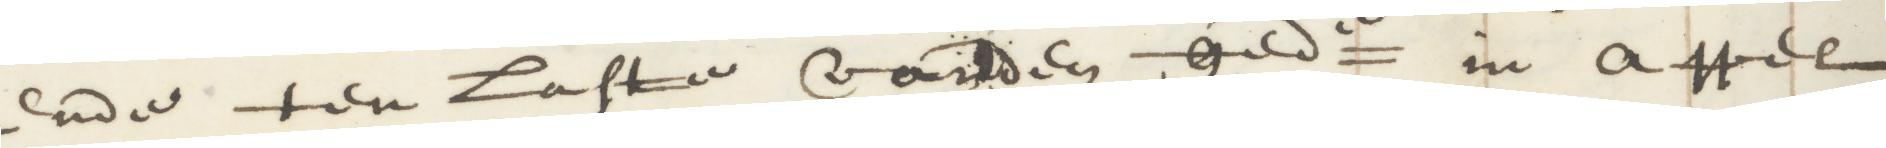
ende ten laste van den ged=e in appel
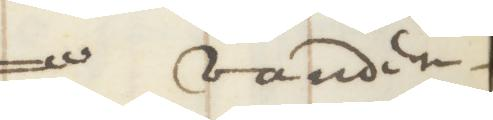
e vanden-
